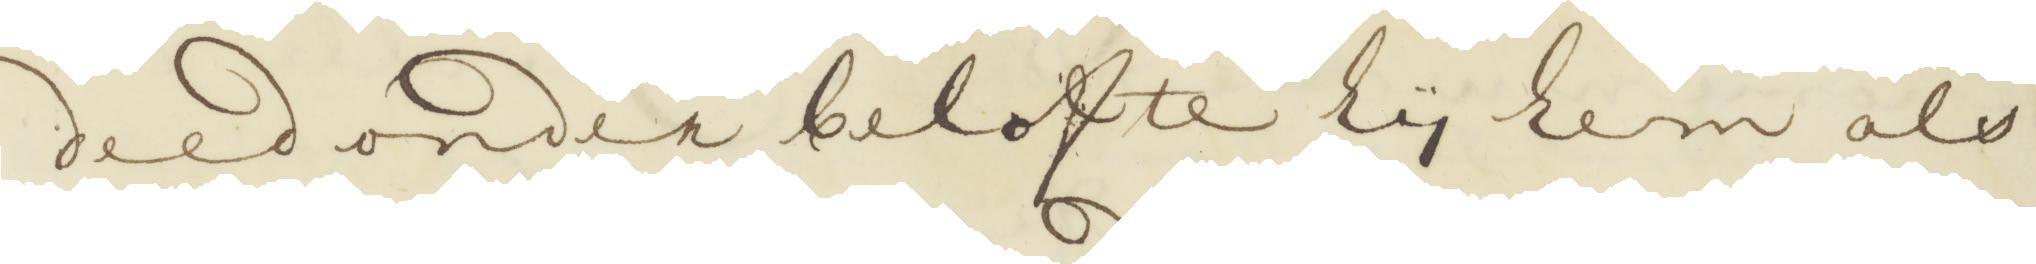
deed onder belofte hij hem als
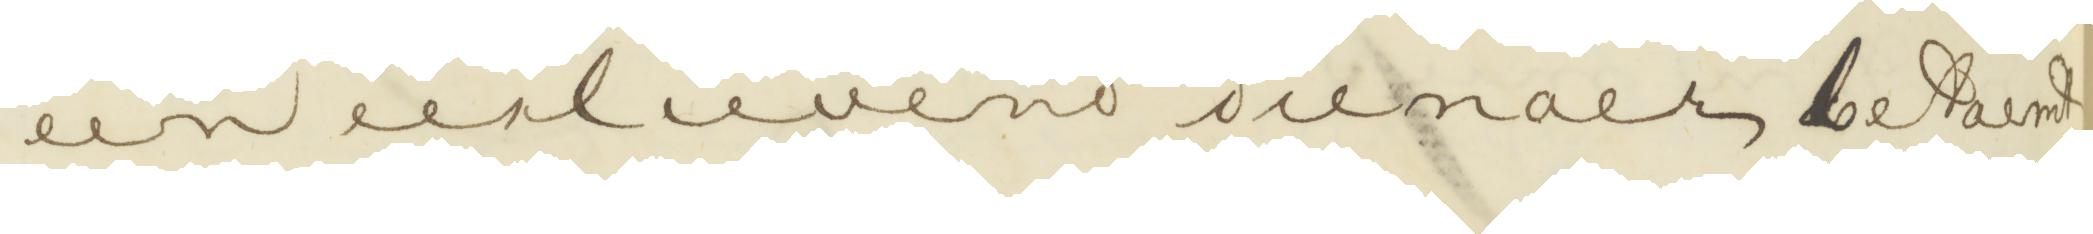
een eerlievend dienaer betaemt
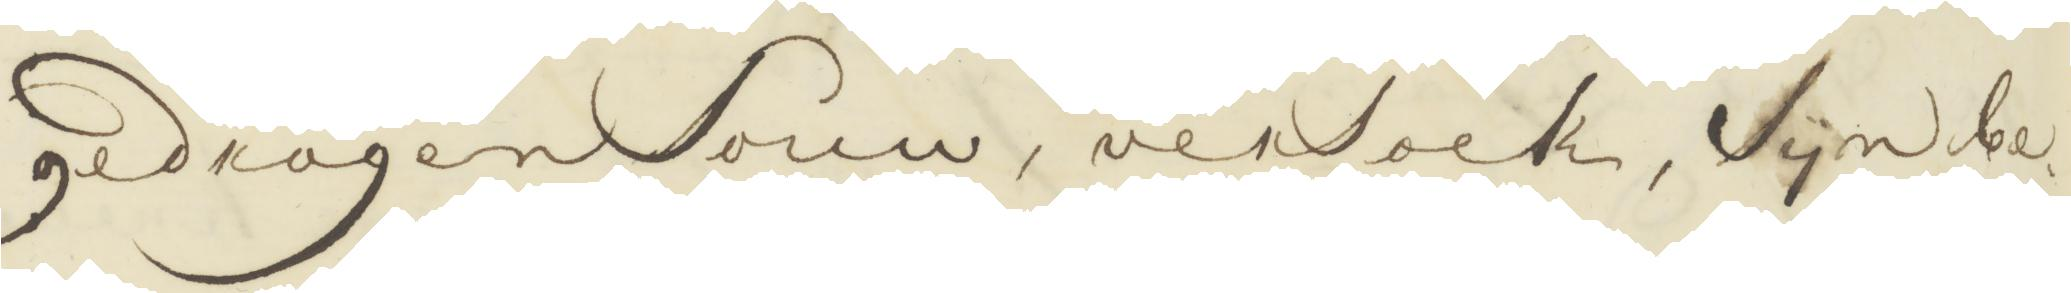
gedragen souw, versoek, sijn be„
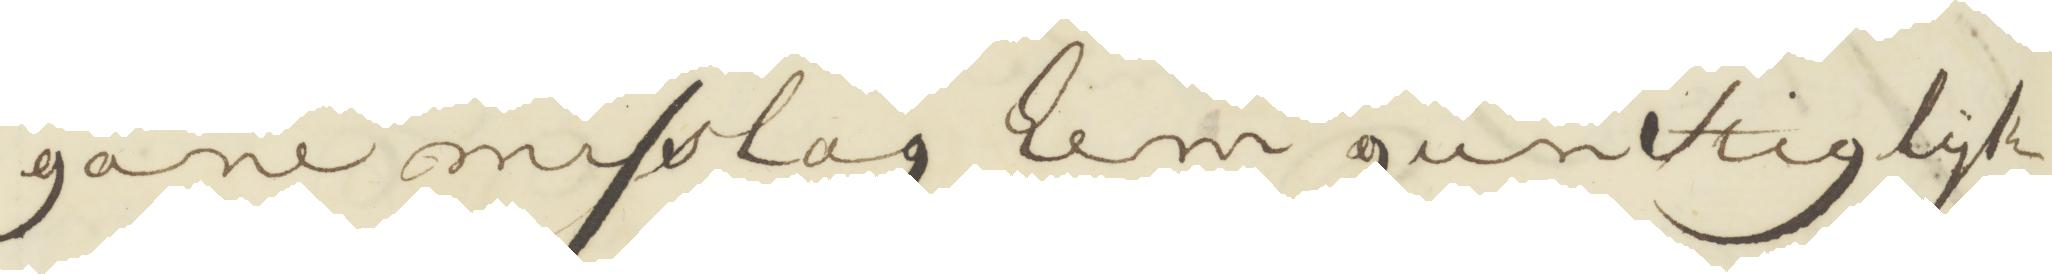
gane misslag hem gunstiglijk
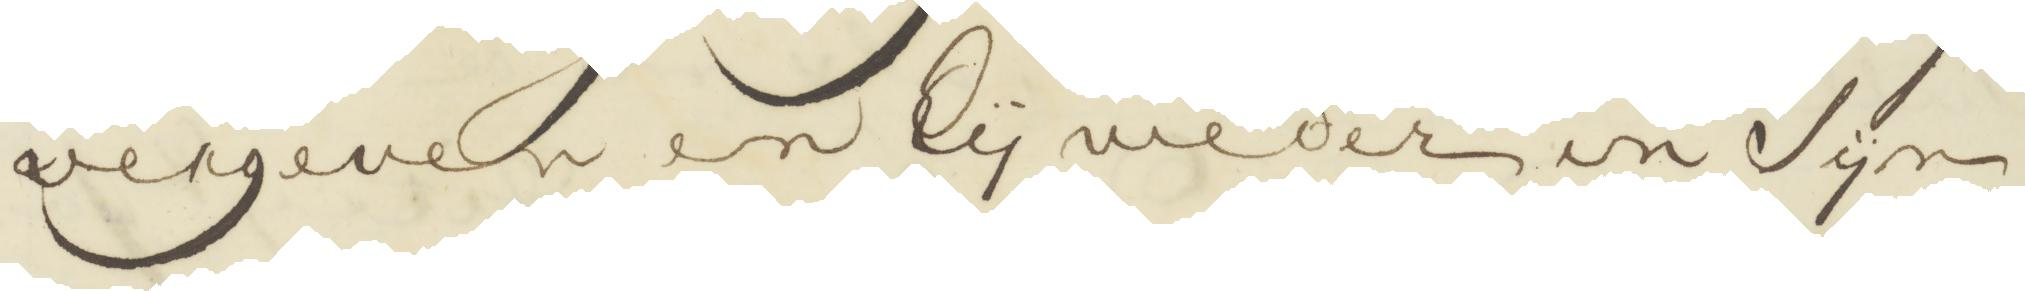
vergeven en hij weder in sijn
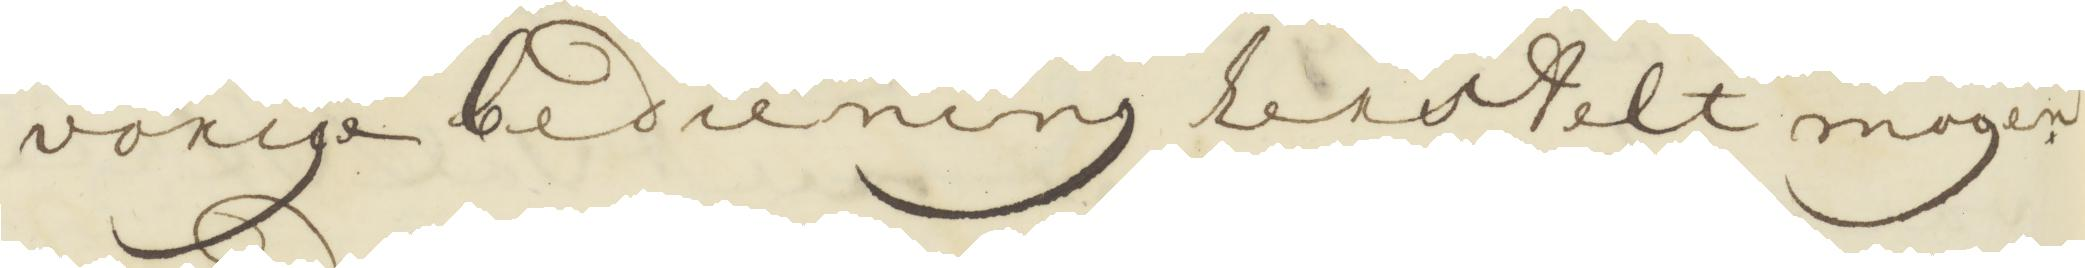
vorige bediening herstelt mogen
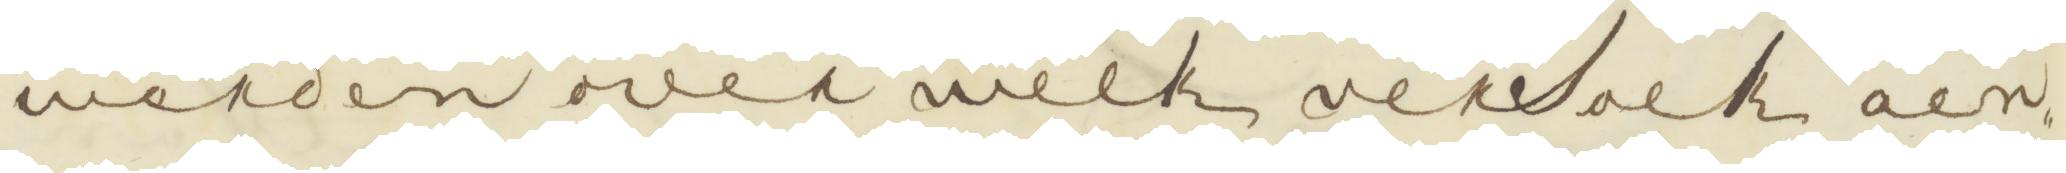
werden over welk versoek aen„
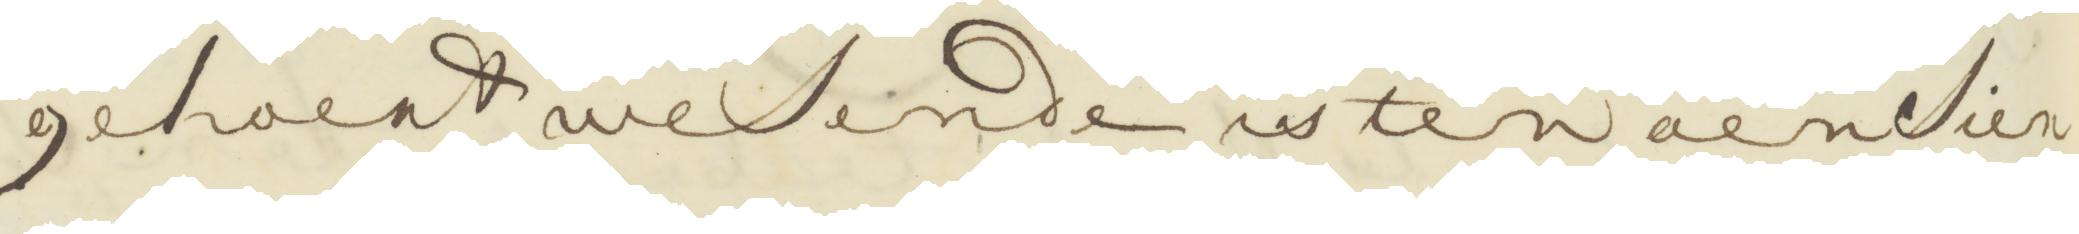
gehoert wesende is ten aensien
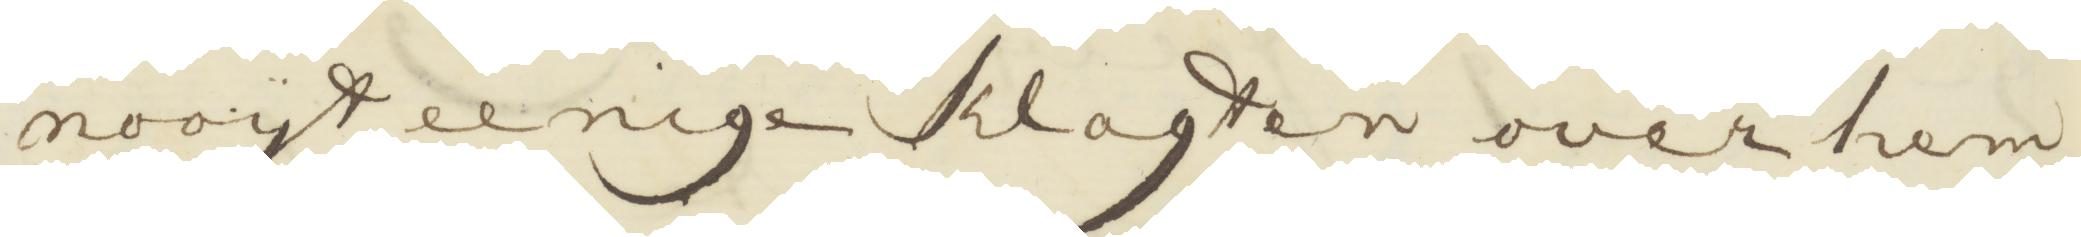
nooijt eenige klagten over hem
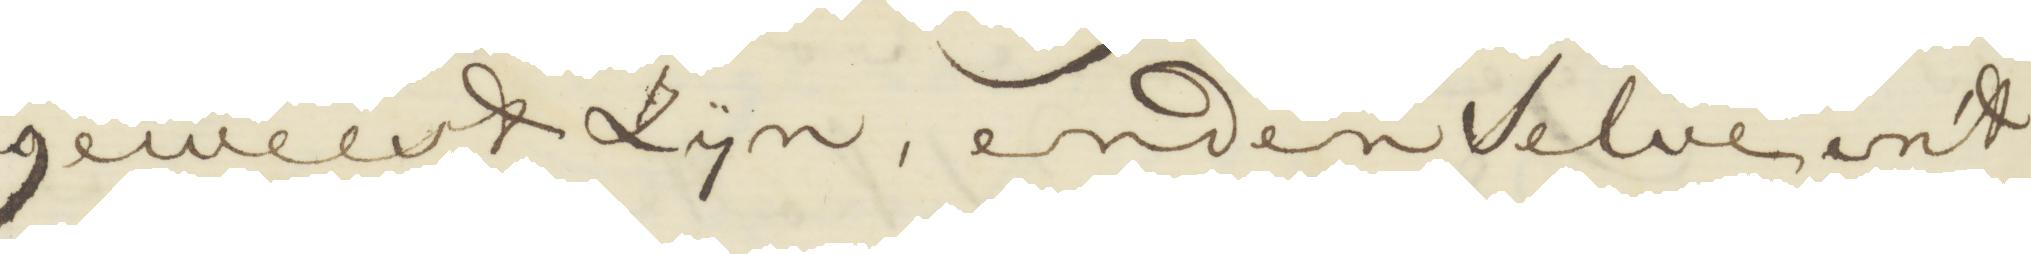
geweest zijn, enden selve in ’t
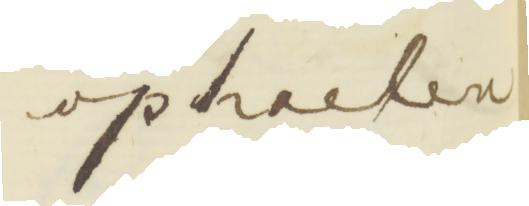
op haelen
